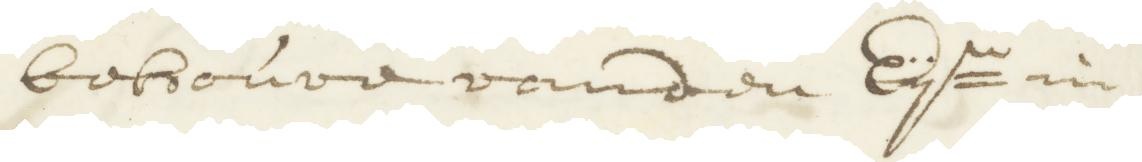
behouve van den Eij=r in
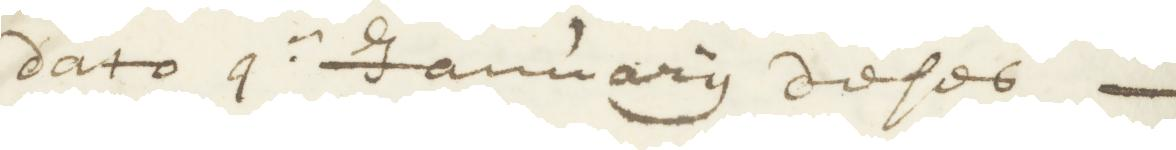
dato 4.e Ianuarij deses —
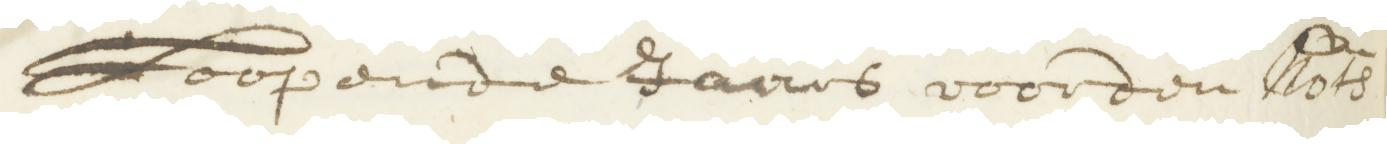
Loopende Iaars voor den Nots
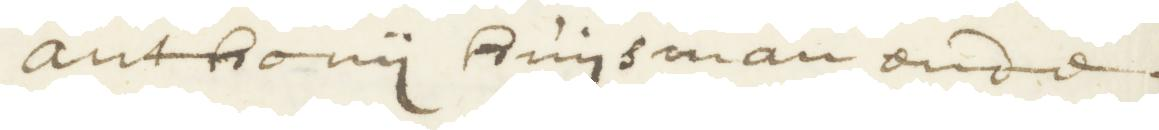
anthonij huijsman ende
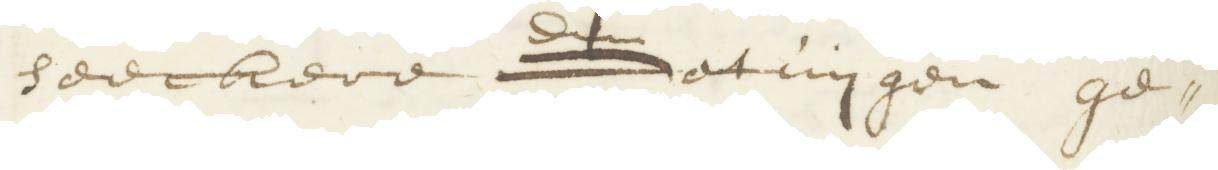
seeckere Getuijgen ge„
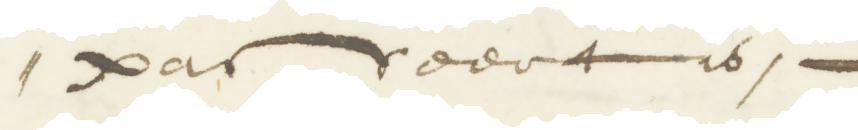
„passeert is, —
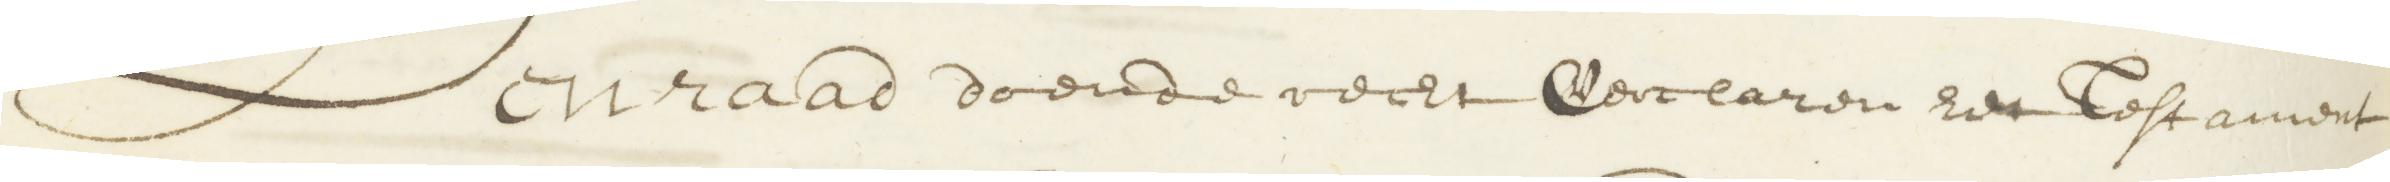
Den raad doende recht verclaren het Testament
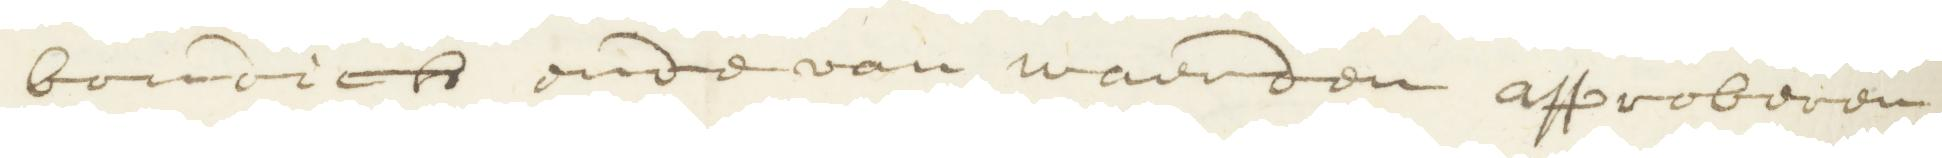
bondich ende van waerden approberen
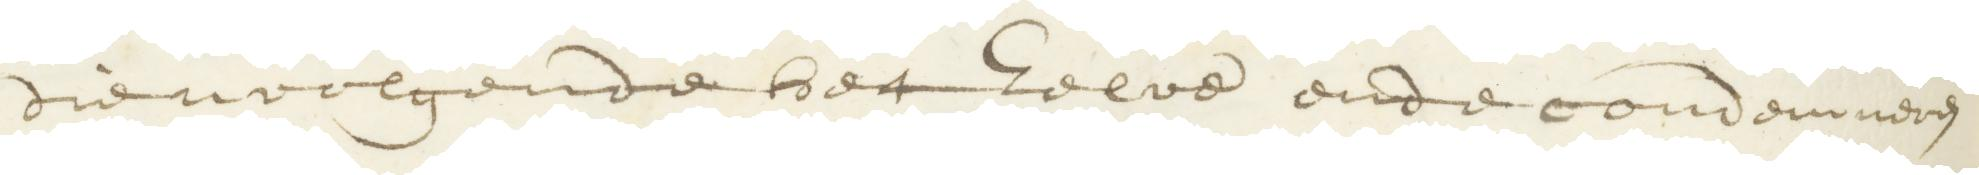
dien volgende het zelve ende condemneren
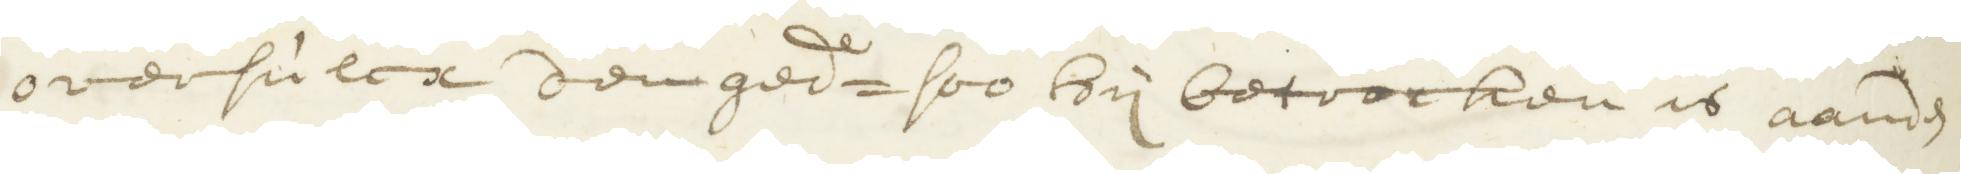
oversulcx den ged=e soo hij betrocken is aanden
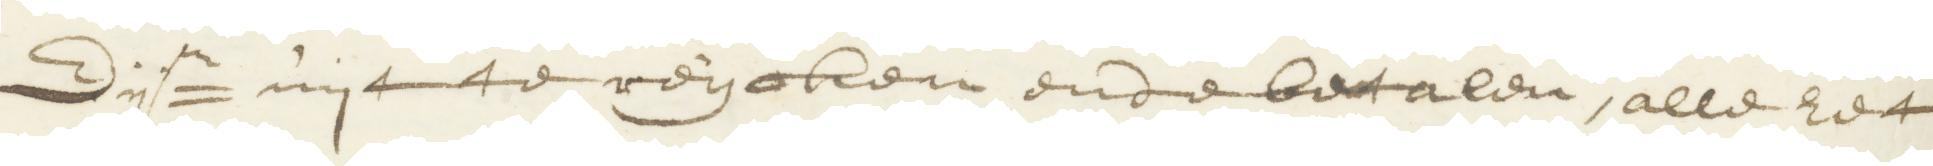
Eij=r uijt te reijcken ende betalen, alle het
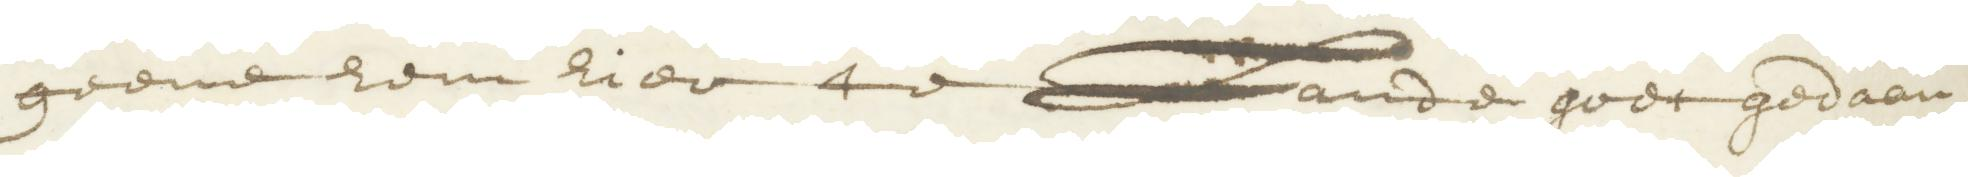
geene hem hier te Lande goet gedaan
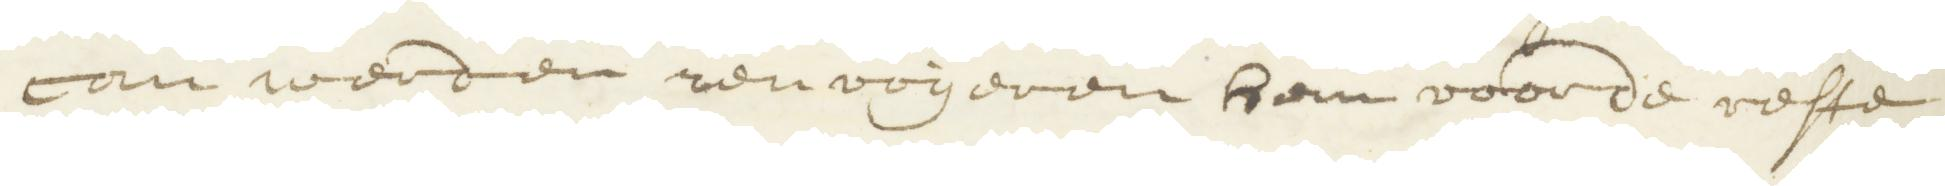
can werden renvoijeren hem voor de reste
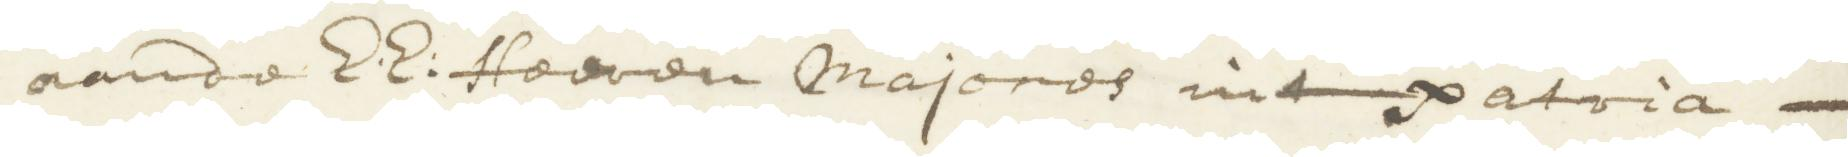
aande E:E: Heeren majores int Patria —
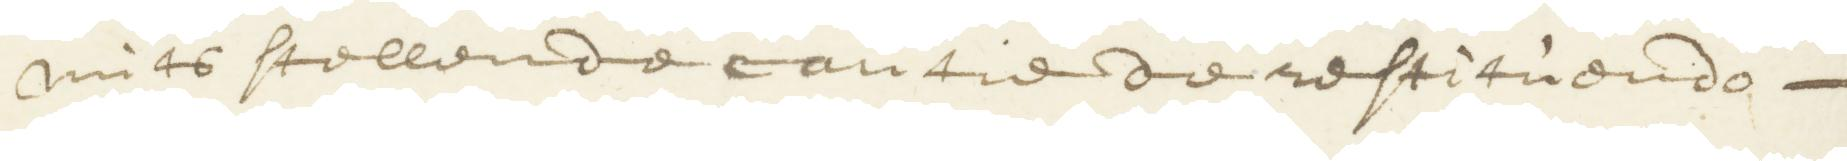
mits stellende cautie de restituendo —
